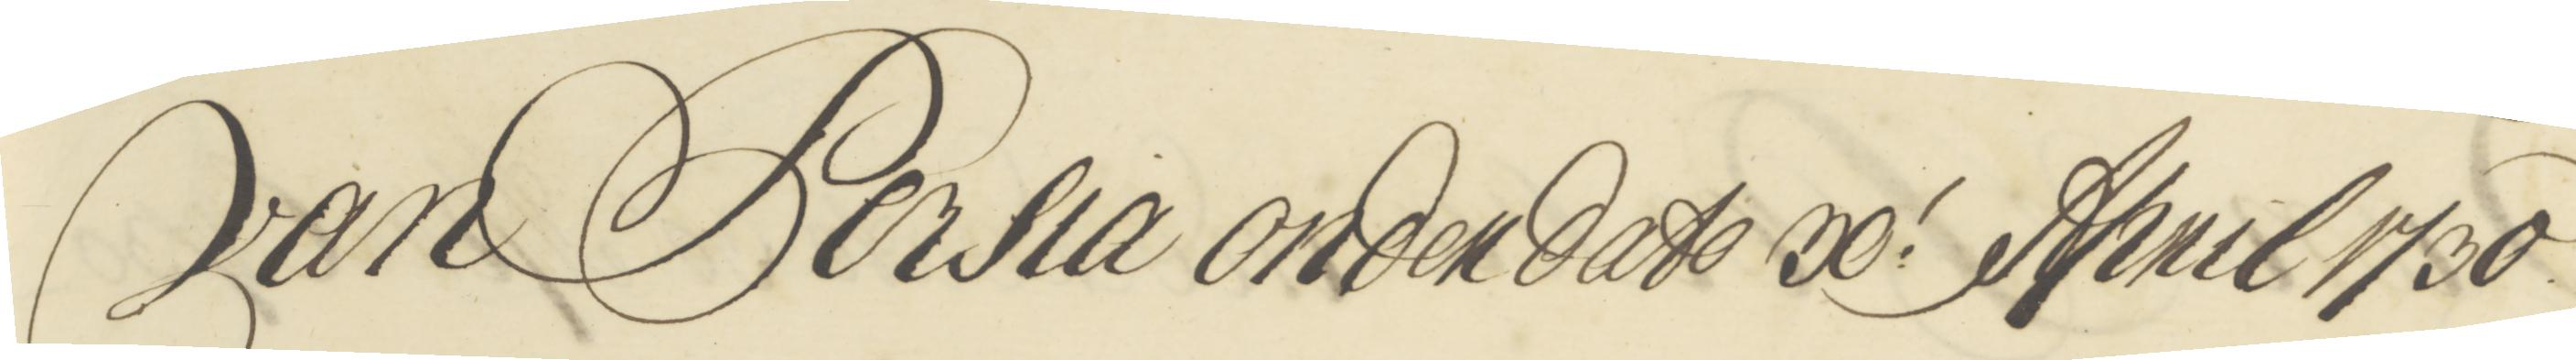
Van Persia onder dato 30:' April 1730.
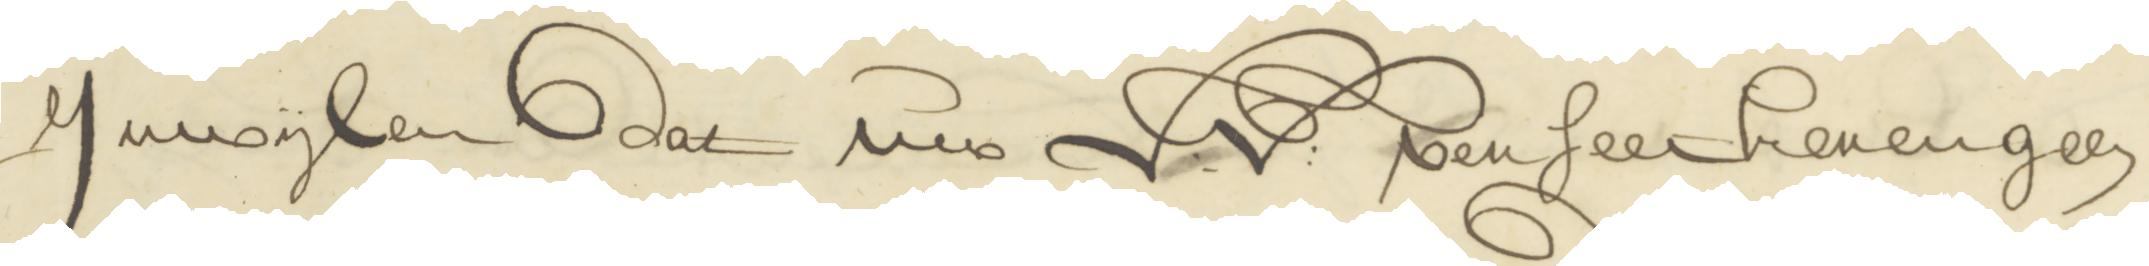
Jnwijlen dat uw E:E: verseeckeren geen
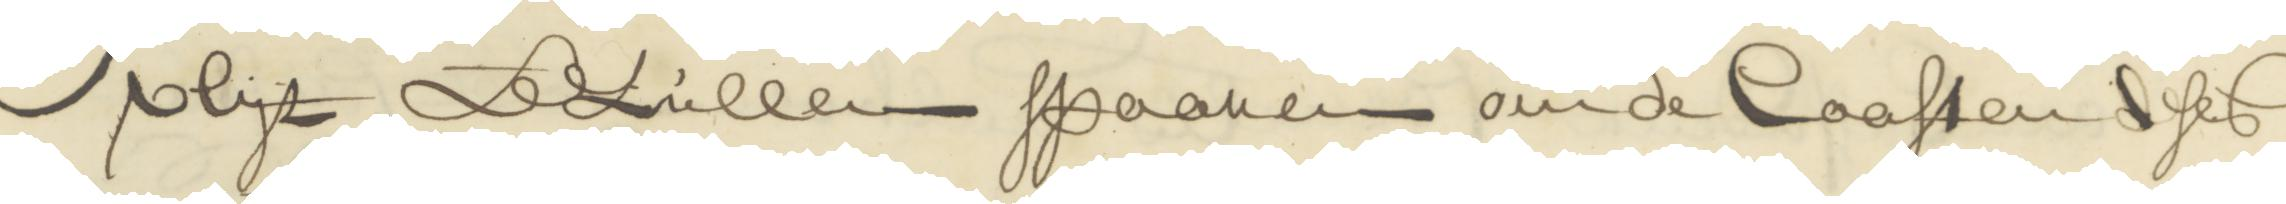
vlijt te zullen spaaren om de laasten deses
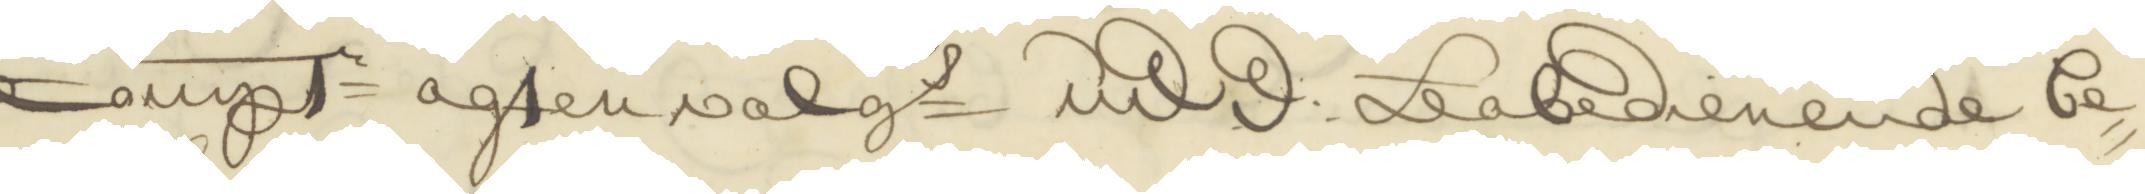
compt=r agter volg=s uEE: te obedierende be„
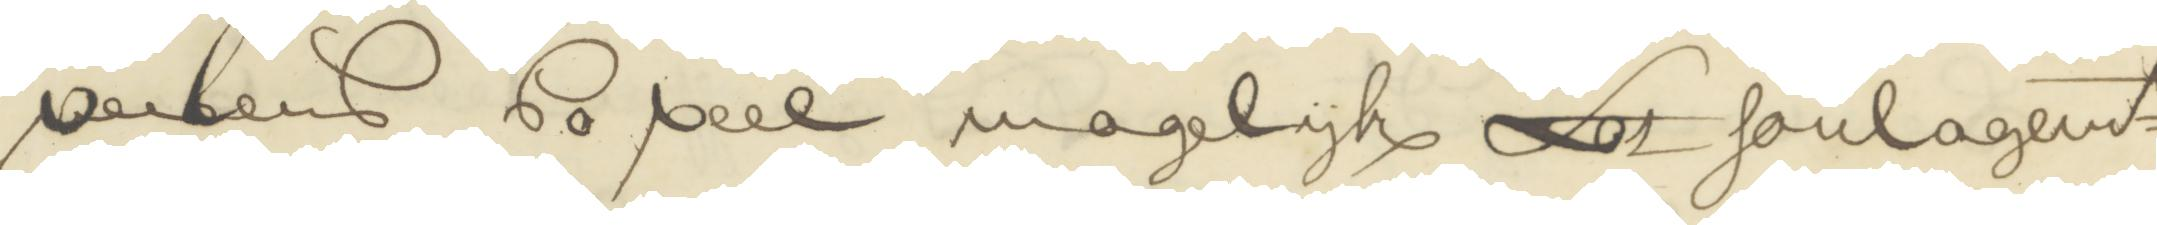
veelens so veel mogelijk tot soulagem=t
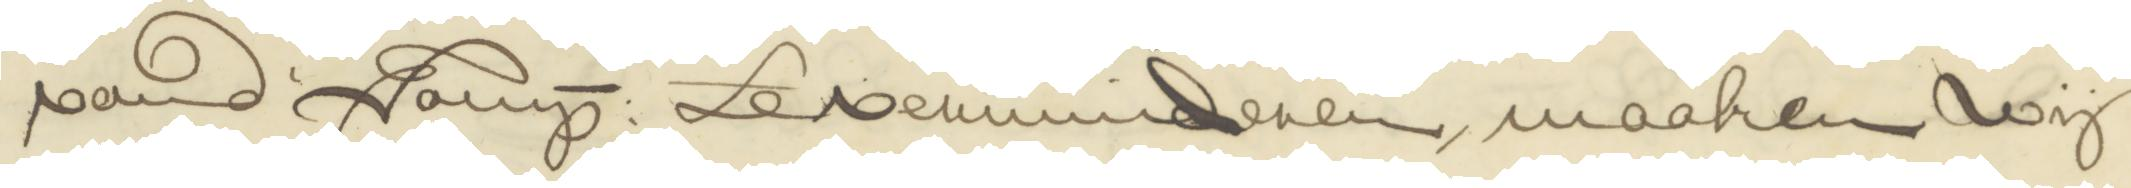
van d'EComp: te verminderen, maaken wij
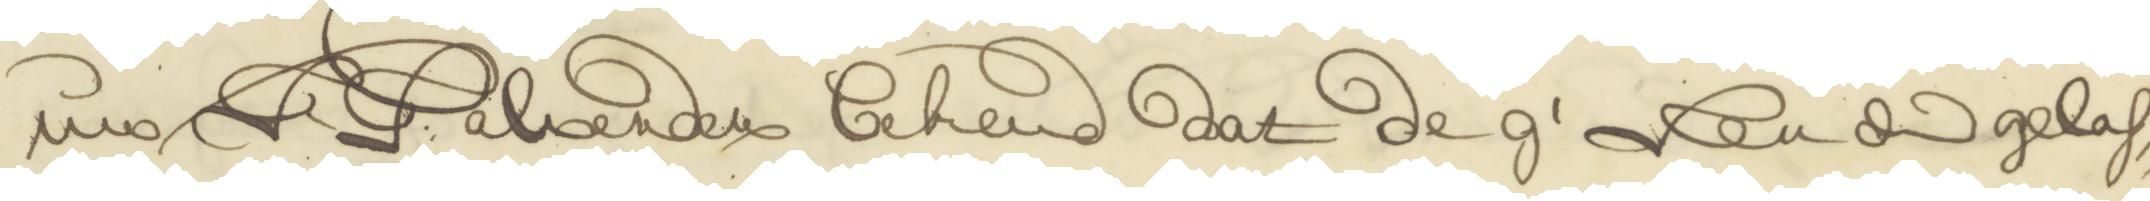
uw EE: alverder bekend dat de g’Eerde gelas
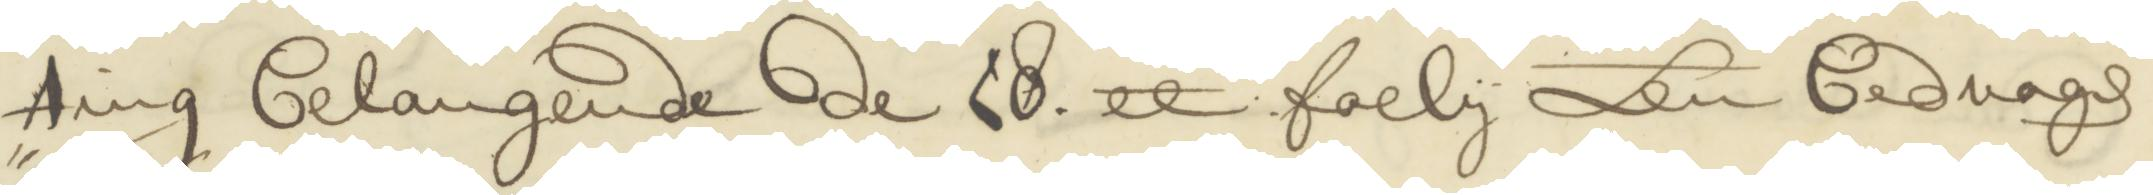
„ting belangende de 58. lb: foelij ten bedragen
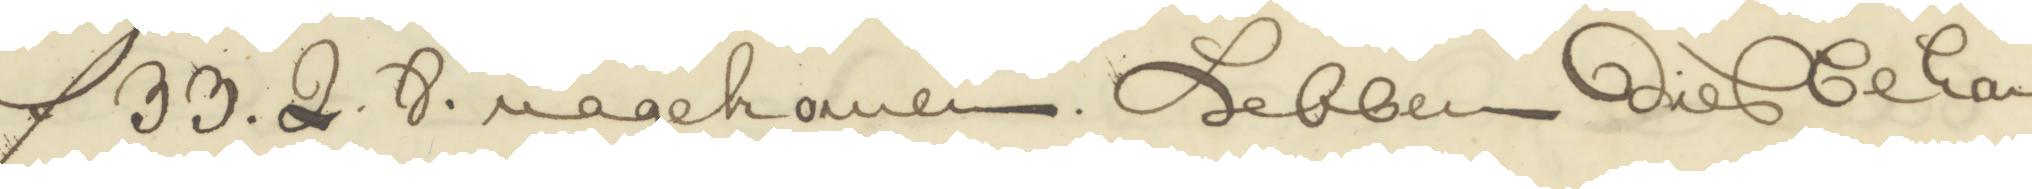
ƒ33.2.8. nagekomen. Hebben dies behan
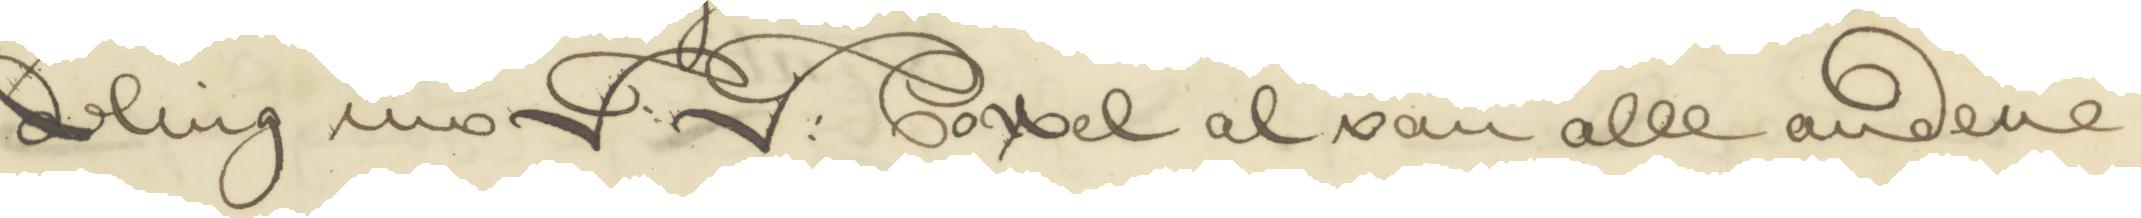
deling uw E:E: sowel al van alle andere
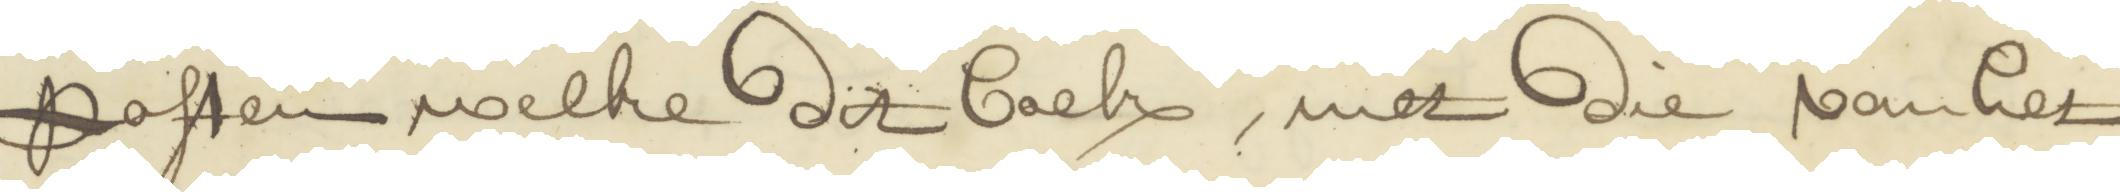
posten welke dit boek, met die van het
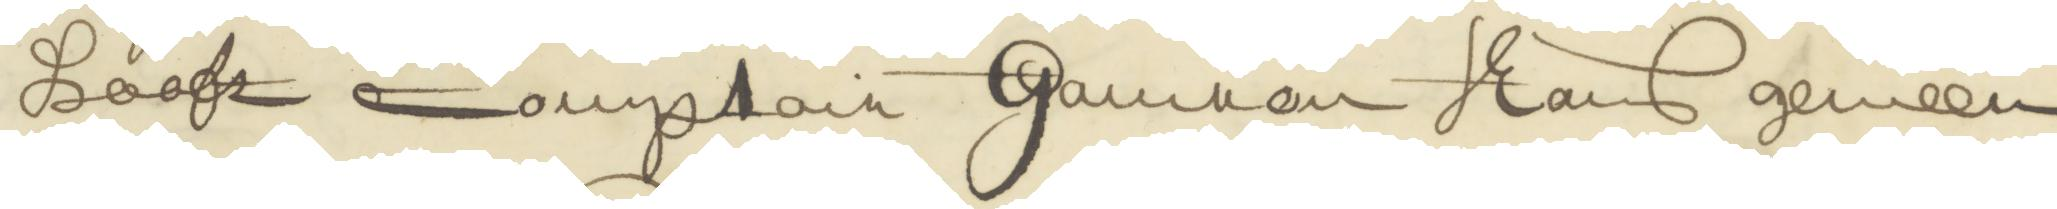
hooft comptoir Gamron thans gemeen
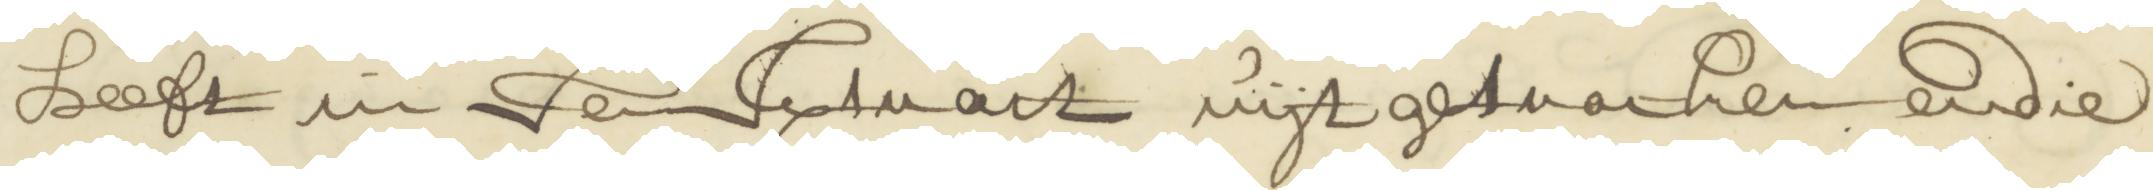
heeft in Een Extract uijt getrocken en die
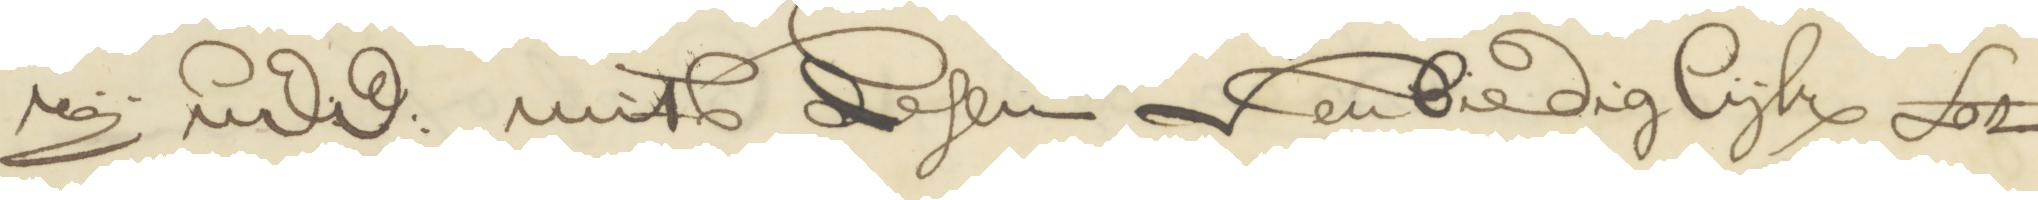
wij uE:E: mits desen Eerbiediglijk tot
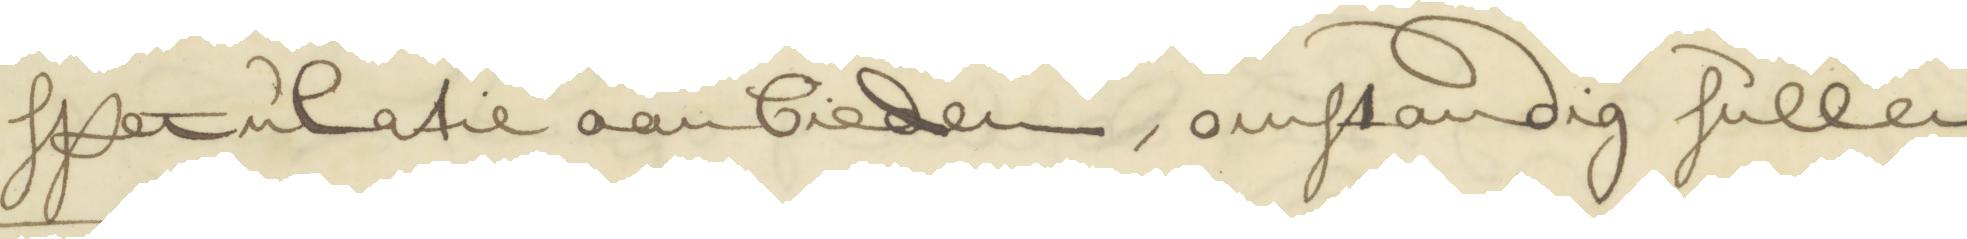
speculatie aanbieden, omstandig sullen
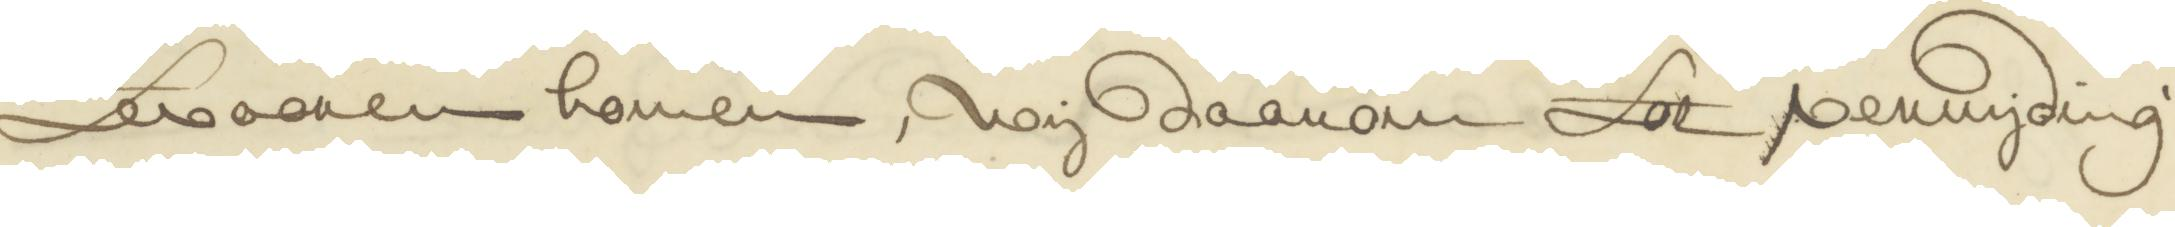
tevooren komen, wij daarom tot verrijding
